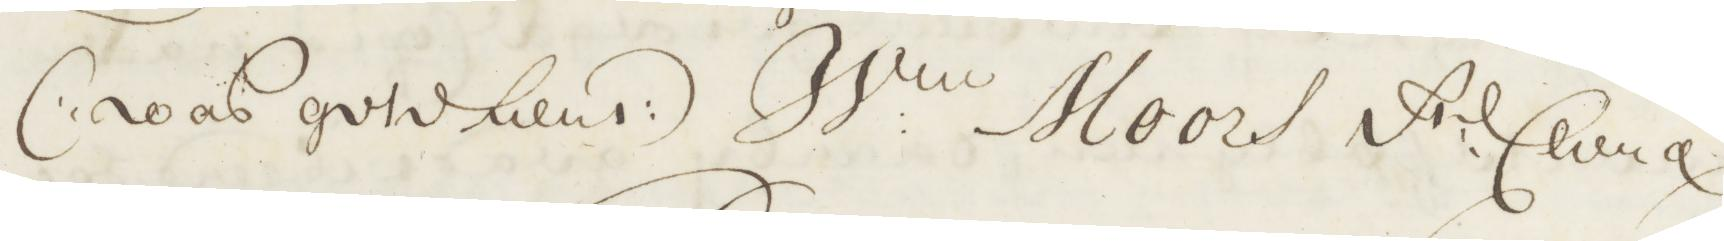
(:was getekent:) W:m Moors E:te Clercq
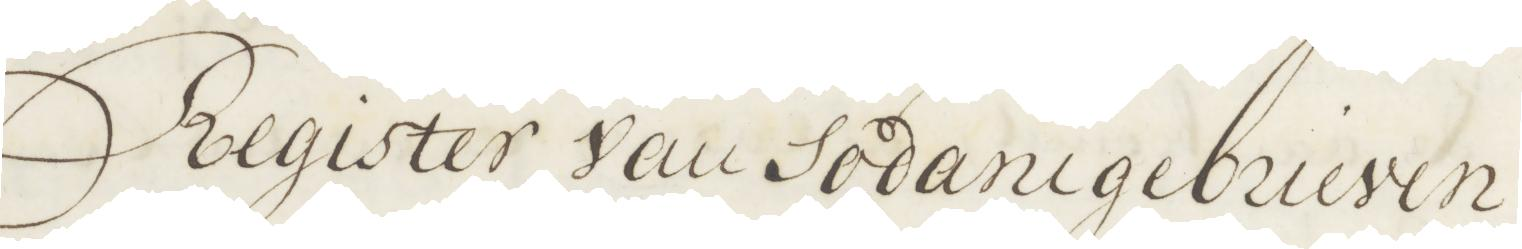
Register van sodanige brieven
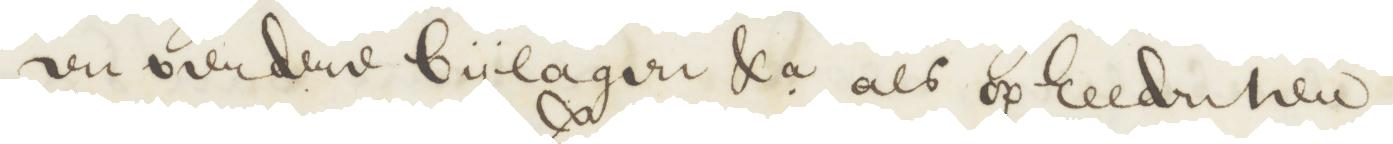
en verdere bijlagen &.a als op heeden ten
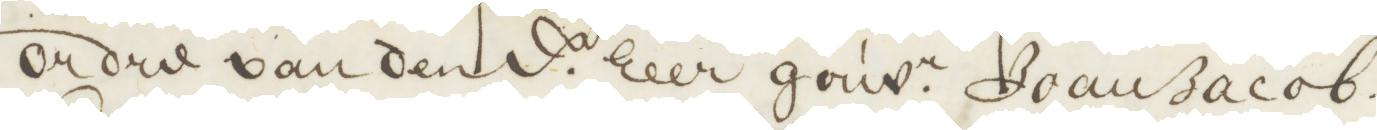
ordre van den E. heer gouv.r Joan Jacob
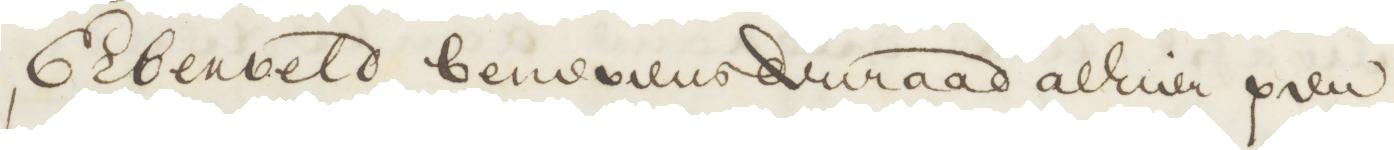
Erberveld benevens den raad alhier per
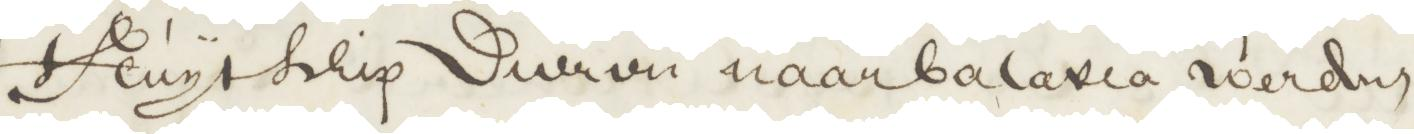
t fluijt schip Dieren naar batavia werden
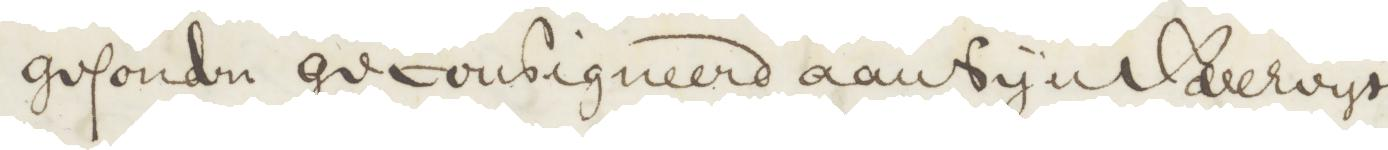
gesonden geconsigneerd aan sijn Edelheijt
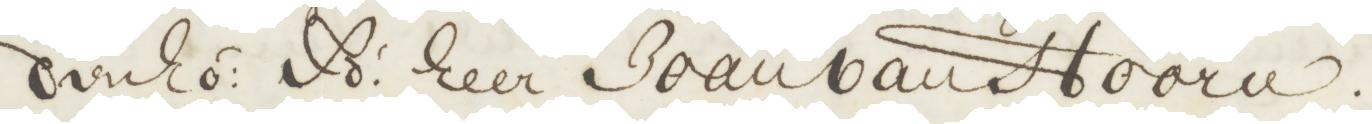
den ho: Ed: heer Ioan van Hoorn.
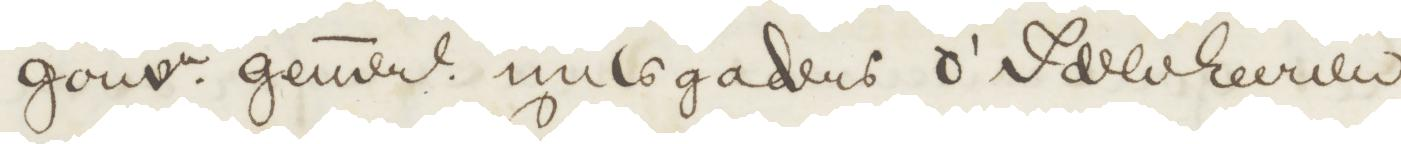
gouv.r gener.l mitsgaders d’ Edele heeren
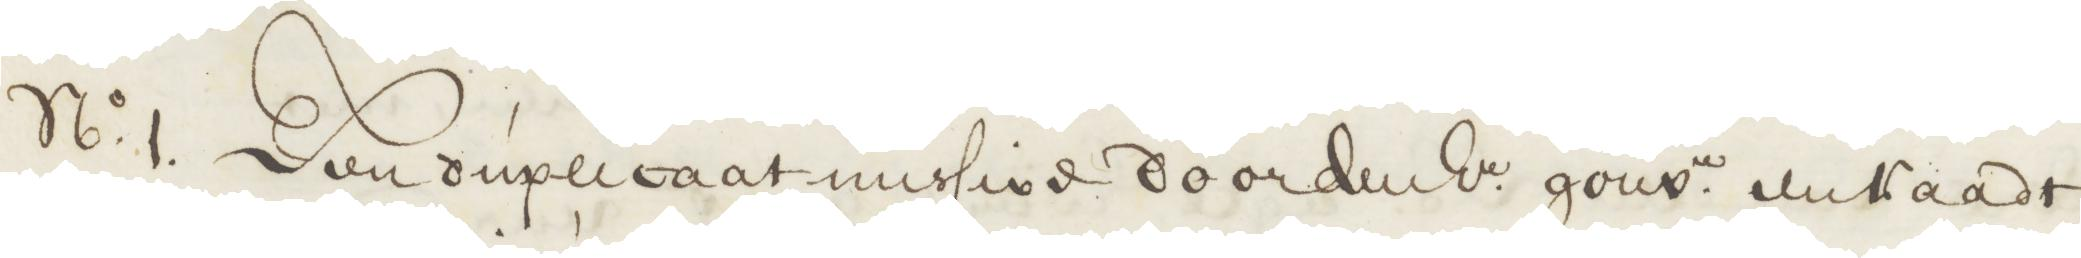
N:o 1. Een duplicaat missive door den h.r gouv.r en raadt
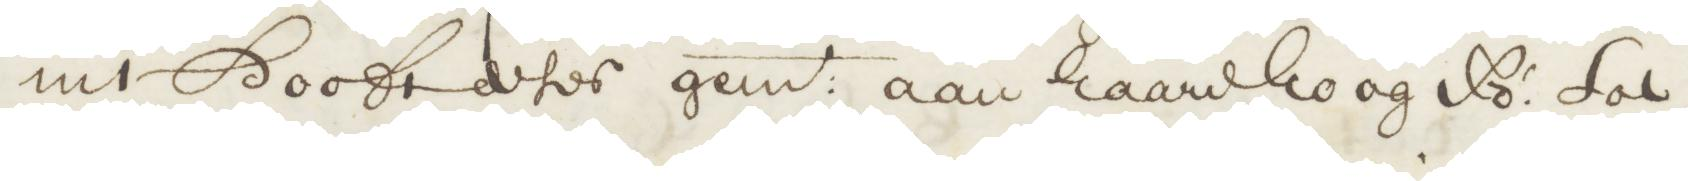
in't Hooft deses gem:t aan haare hoog Ed.s tot
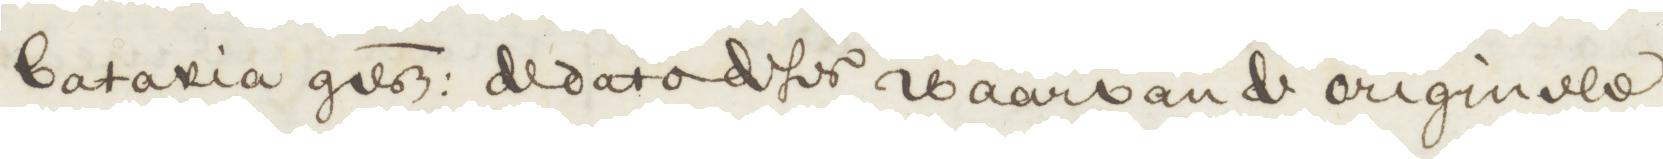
batavia gesz: de dato deses waarvan de originele
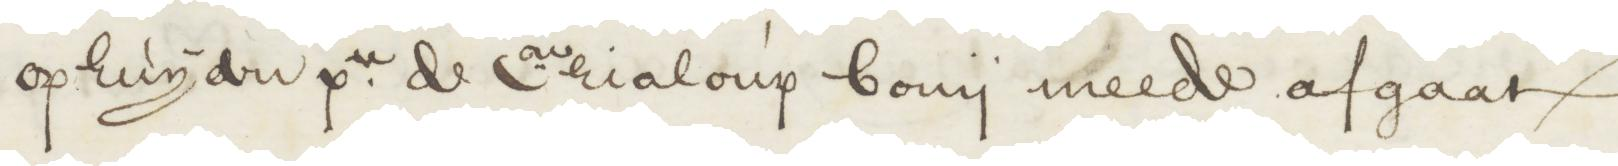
op huijden p.r de Chialoup bonij meede afgaat
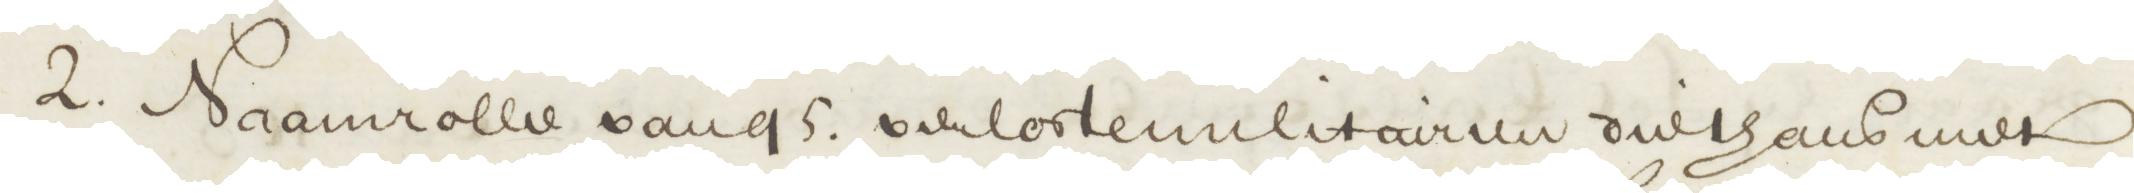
2. Naamrolle van 45. verloste militairen die thans met
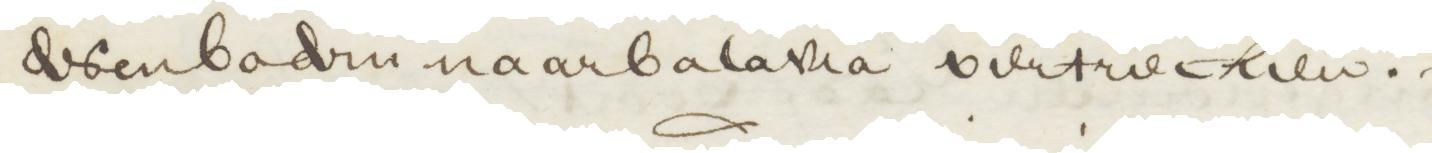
desen bodem naar batavia vertrecken.
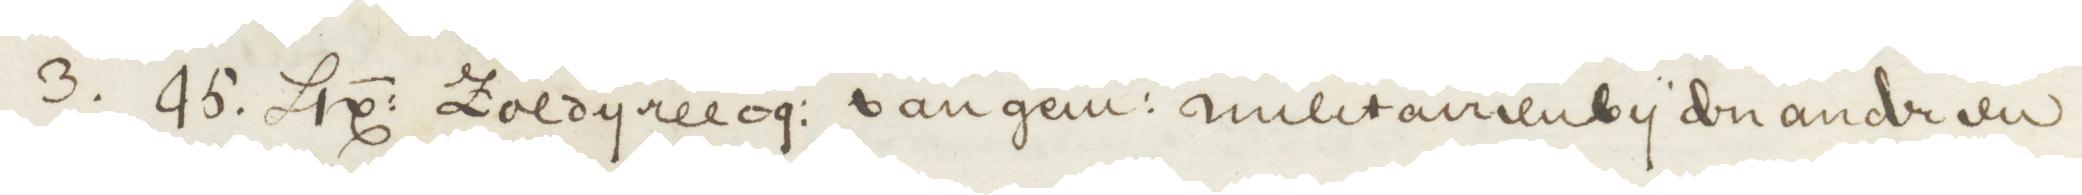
3. 45. stx: zoldij reecq: van gem: militairen bij den ander en
